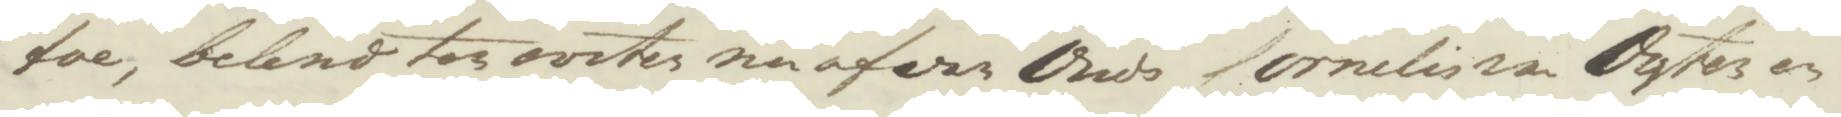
toe, belend ten oosten nu af van Ouds Cornelis van Ogten en
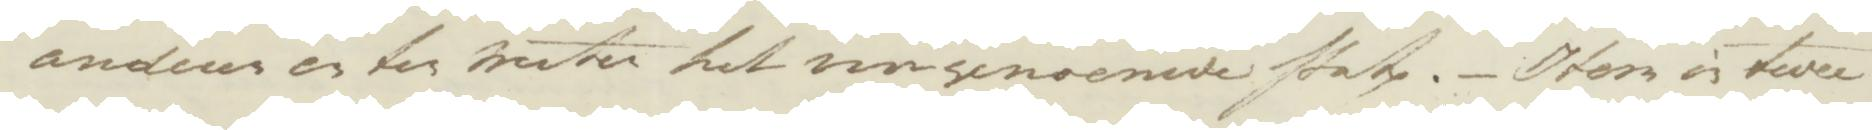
anderen en ten westen het voorgenoemde stuk. -Item in twee
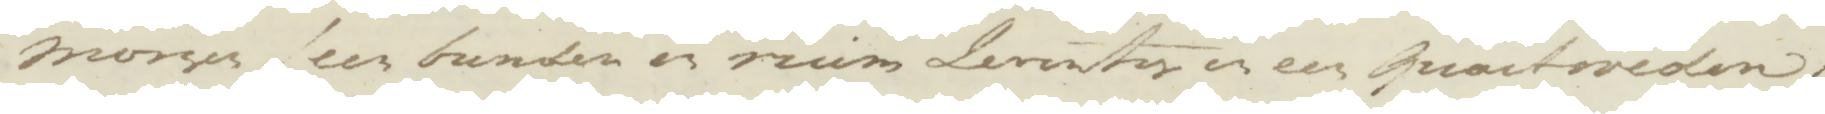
morgen /een bunder en ruim Zeventig in een Quart roeden /
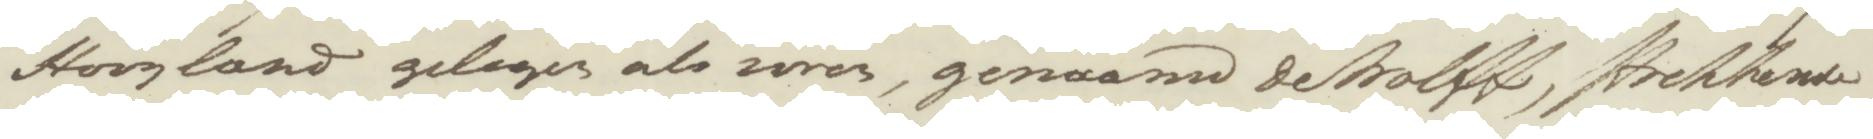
Hooyland gelegen als voren, genaamd de Wolff, strekkende
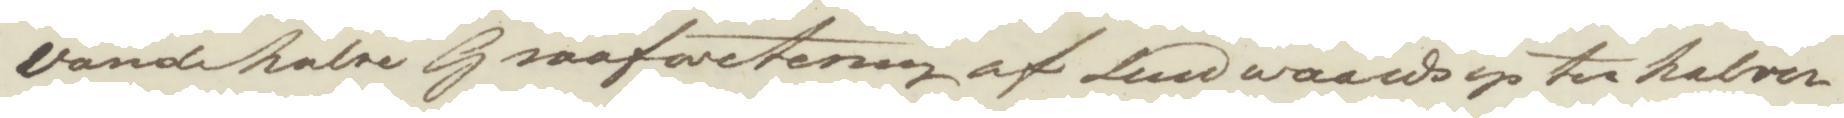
van de halve Graafwetering af Zuidwaards op ten halven
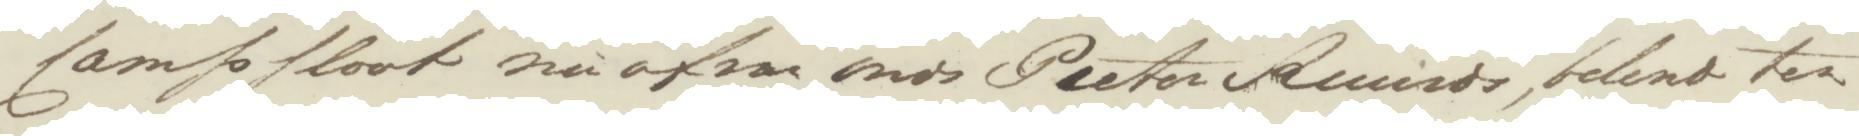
Campsloot nu of van ouds Pieter Ruurds, belend ten
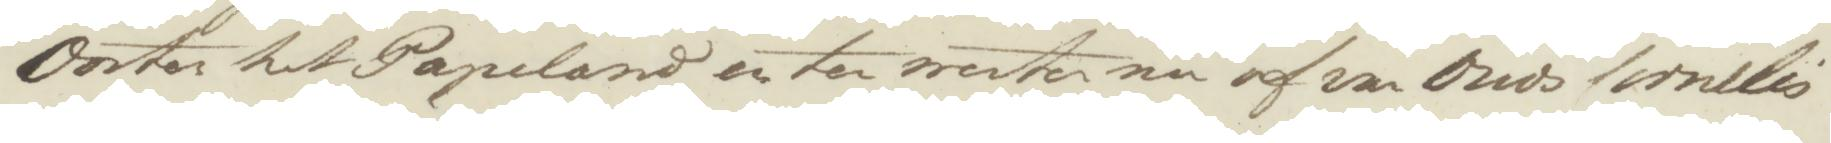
Oosten het Papeland en ten westen nu of van ouds Cornelis
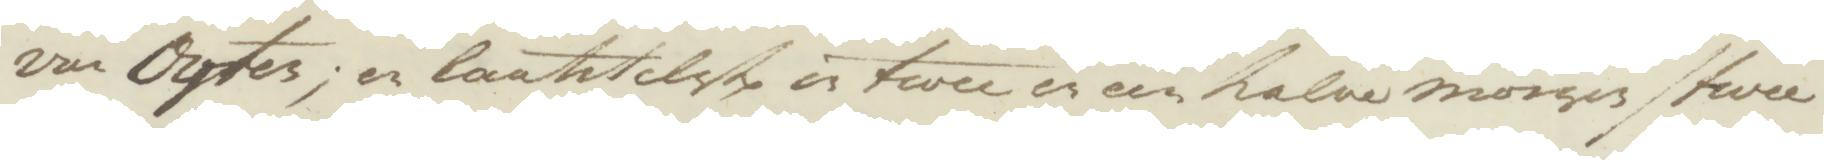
van Ogten; en laatstelyk en twee en een halve morgen / twee
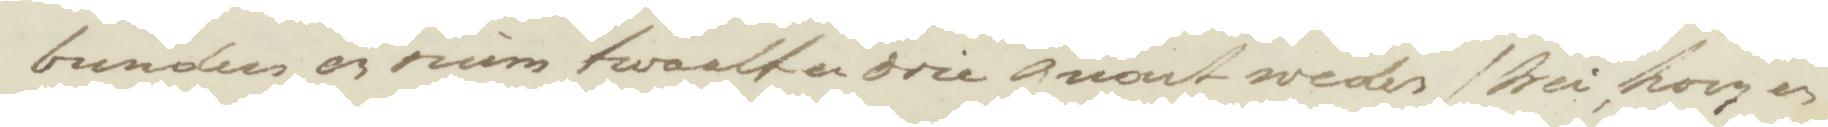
bunders en ruim twaalf en drie quart roeden / Wei, hooy en
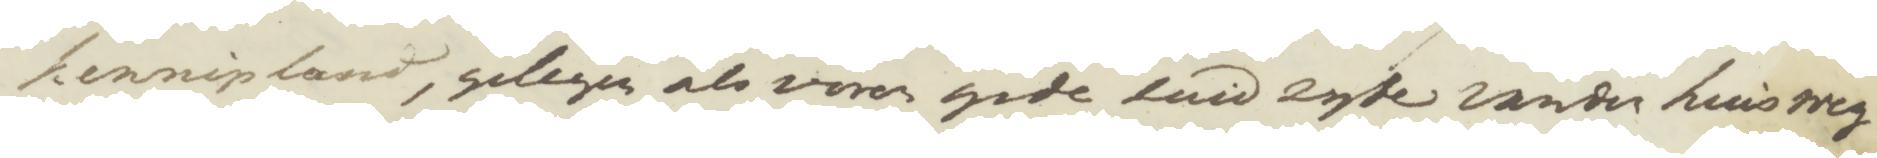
hennipland, gelegen als voren op de zuidzyde van den huisweg
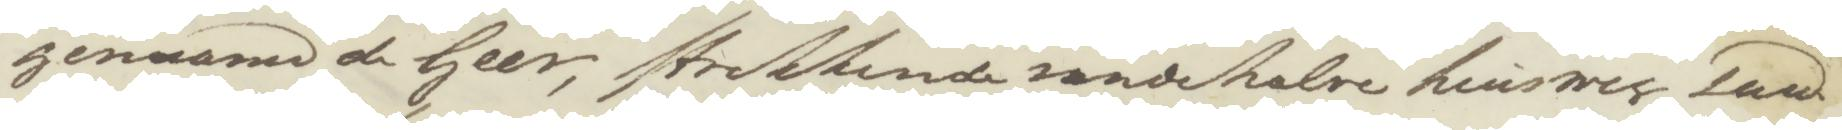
genaamd de Geer, strekkende van de halve huisweg zuid
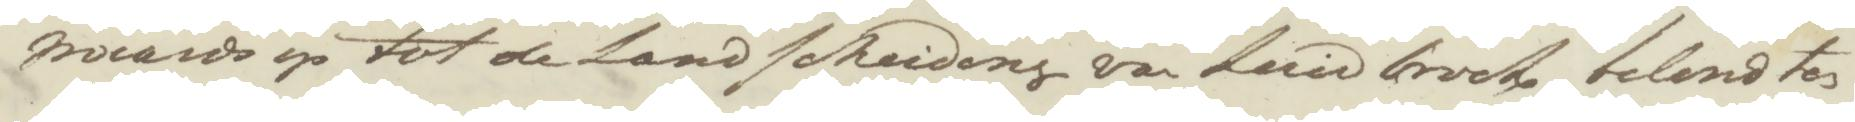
waards op tot de Landscheiding van Zuidbroek belend ten
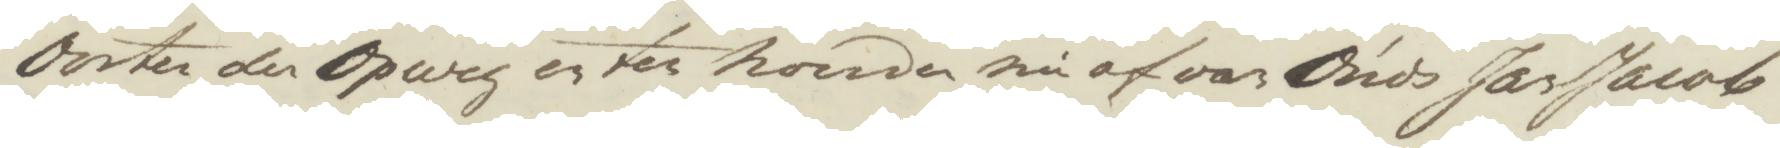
Oosten den Opweg en ten Noorden nu of van Ouds Jan Jacob
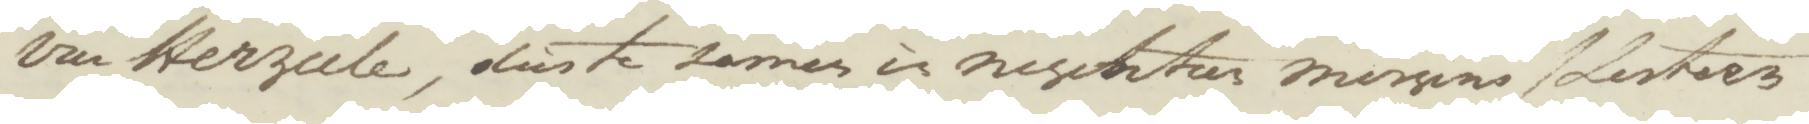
van Herzeele, dus te zamen in negentien morgens / Zestien
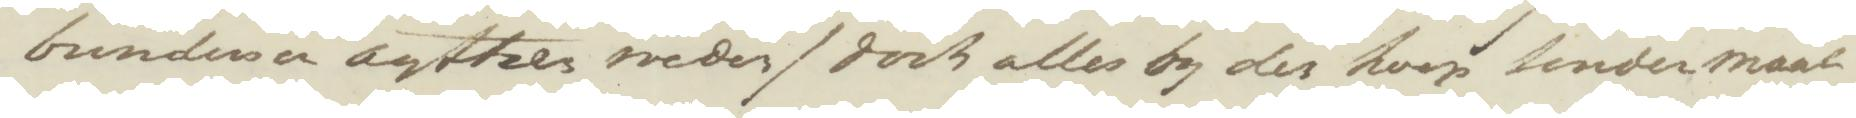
bunders en agttien roeden / doch alles by den koop zonder maat
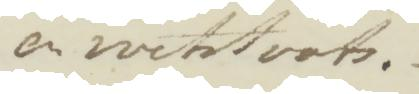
en voetstoot.
